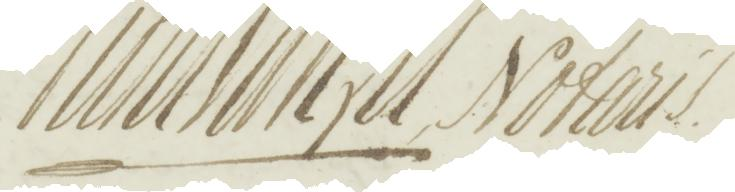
Piter van Lée, Notaris.
